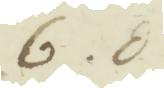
6. d
